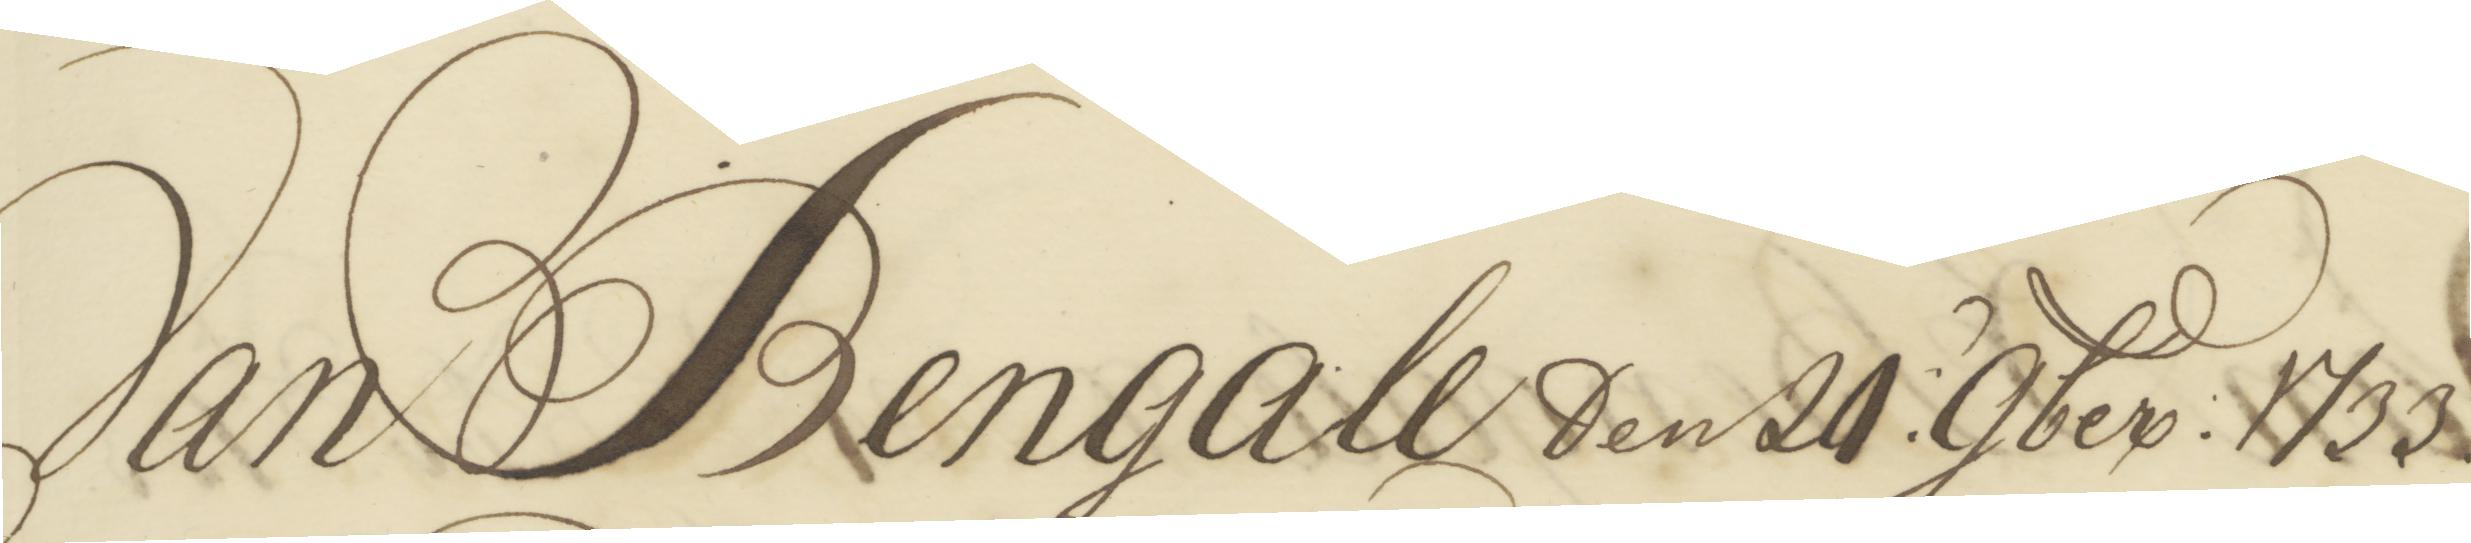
Van Bengale den 24:' 9ber: 1733.
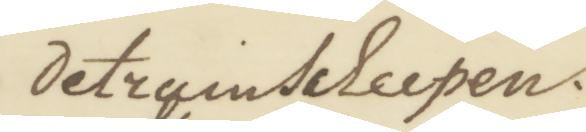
de train scheepen.
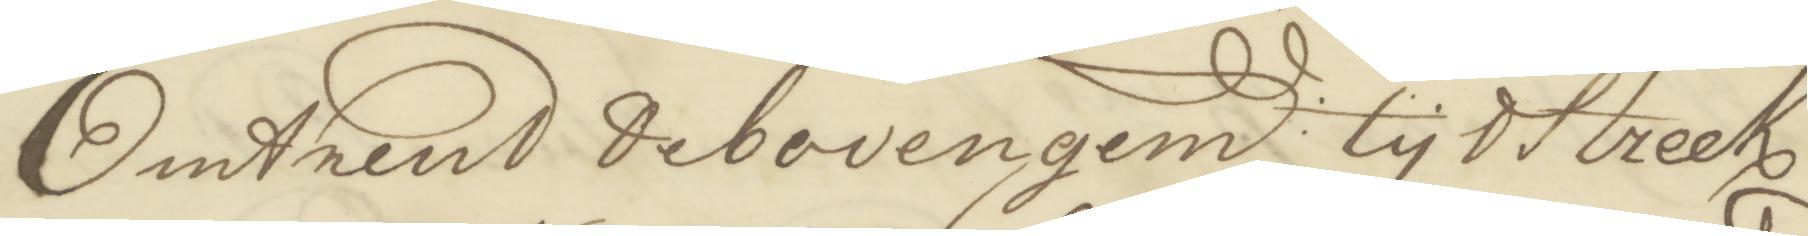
Omtrend de bovengem: tijdstreek
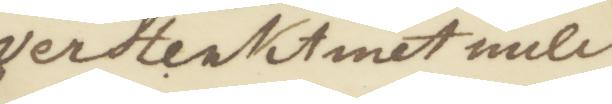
versterkt met mili
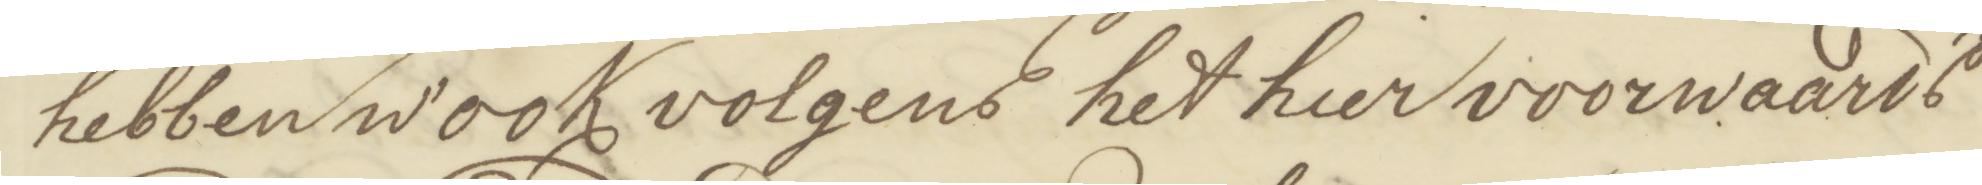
hebben w'ook volgens het hier voorwaards
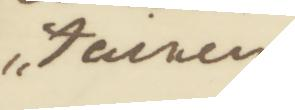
„tairen
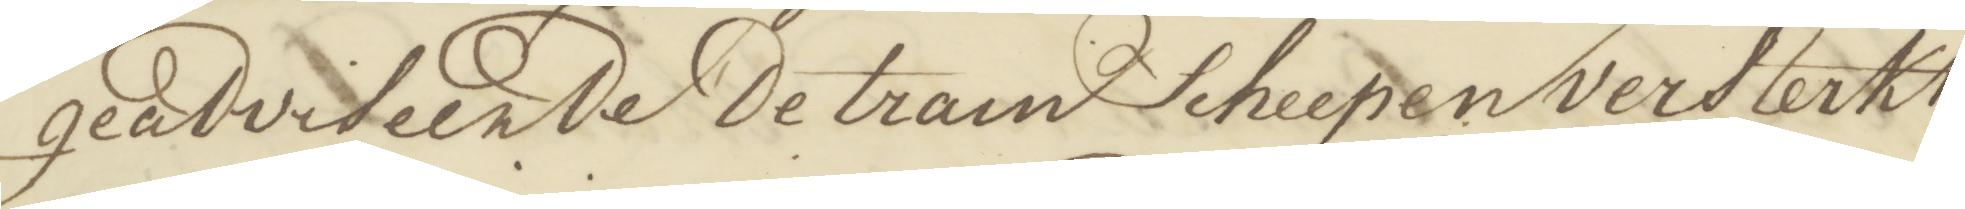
geadviseerde de train scheepen versterkt
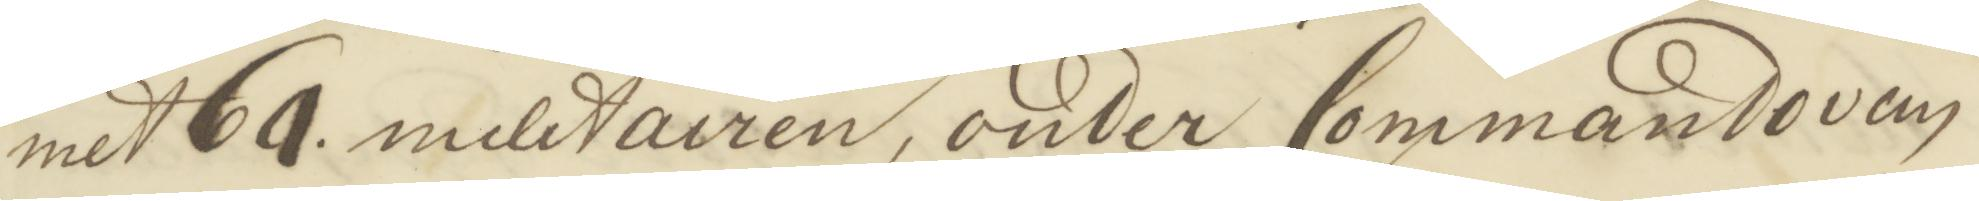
met 64. militairen, onder Commando van
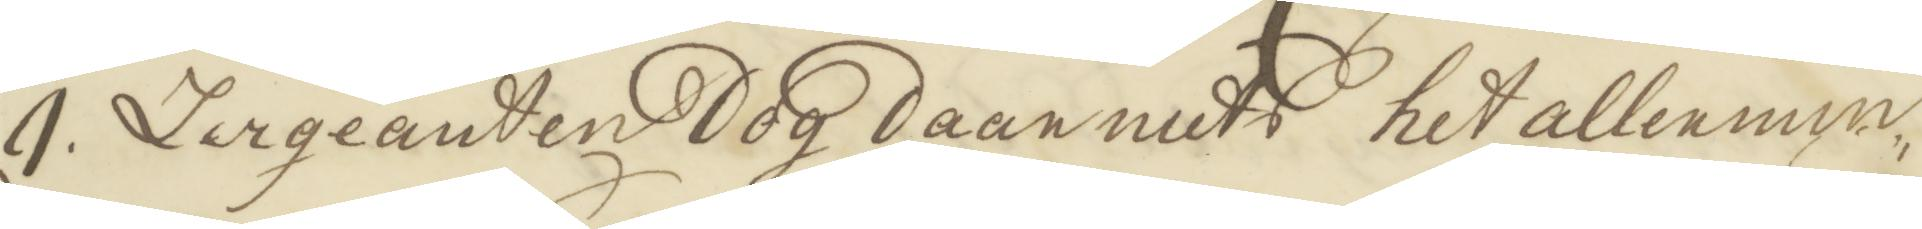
4. zergeanten dog daar niets het allermin„
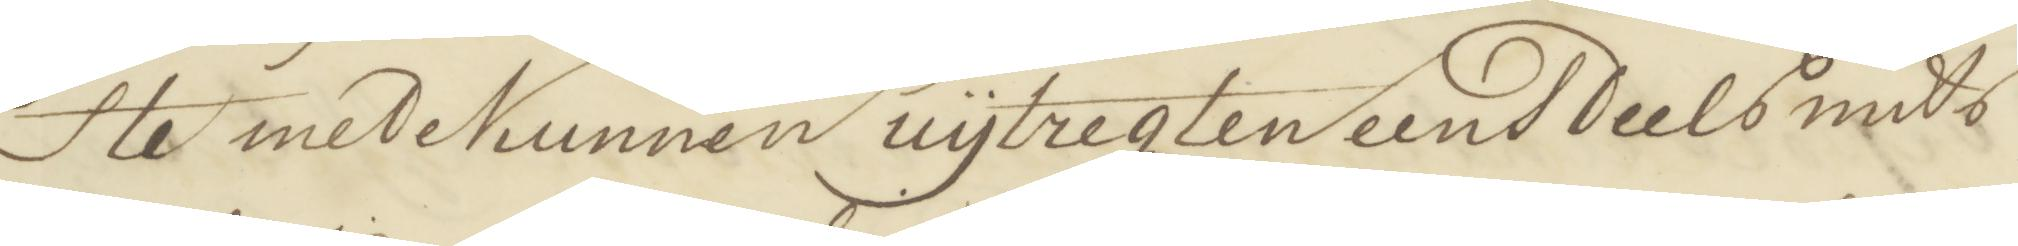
ste mede kunnen uijtregten eens deels mits
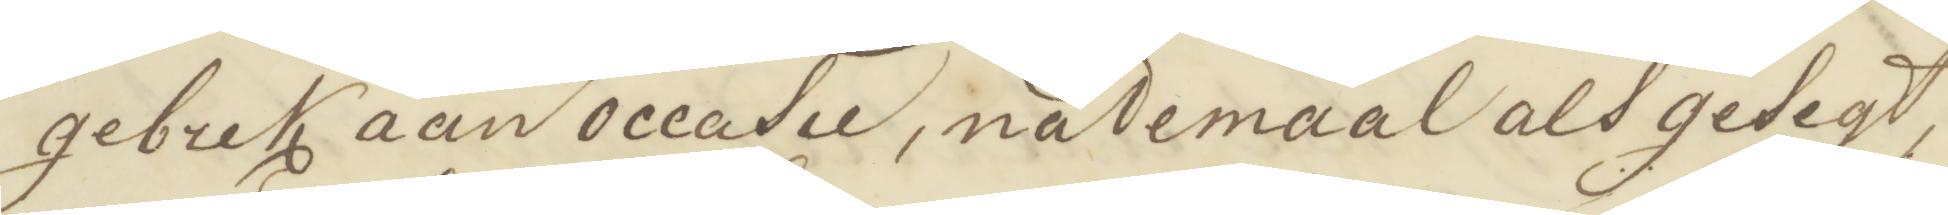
gebrek aan occasie, nademaal als gesegt,
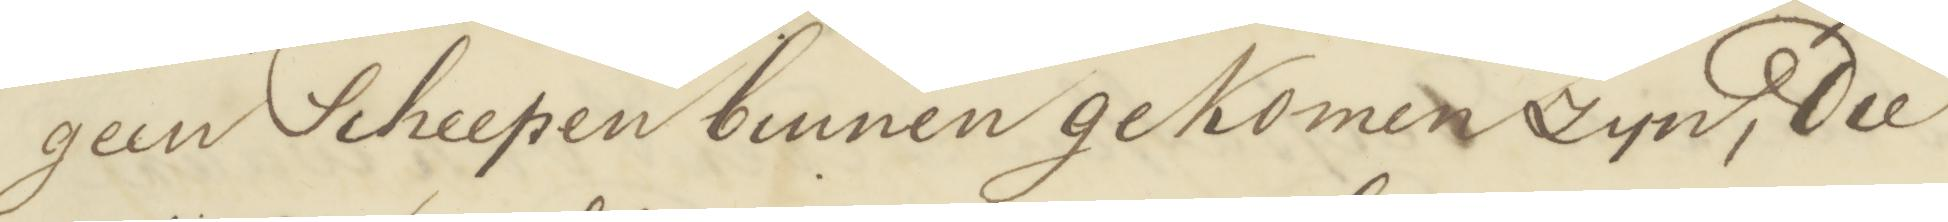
geen scheepen binnen gekomen zijn, die
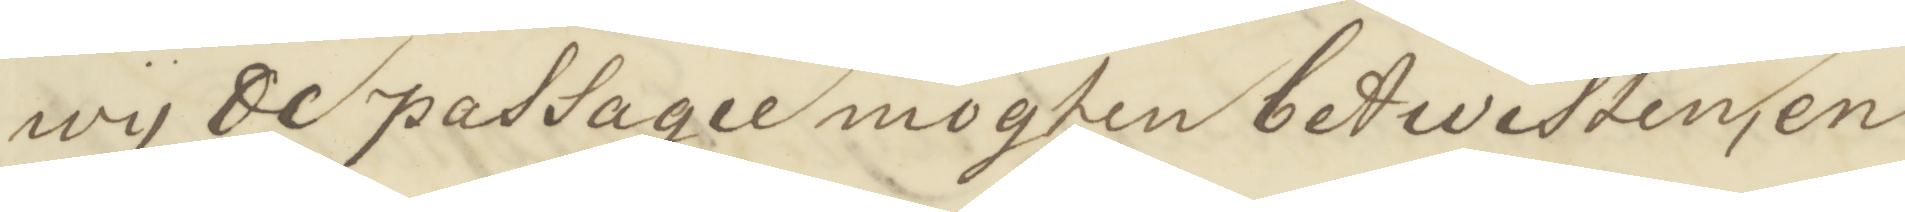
wij de passagie mogten betwisten, en
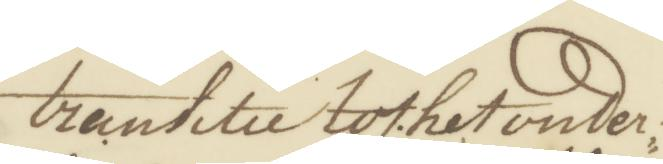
transitie tot het onder„
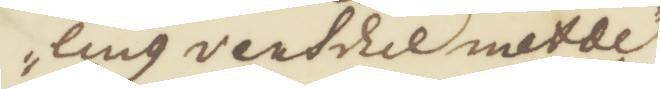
„ling verschil met de
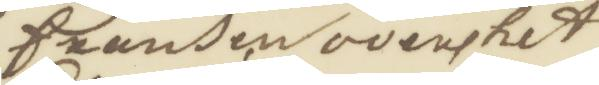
fransen over het
